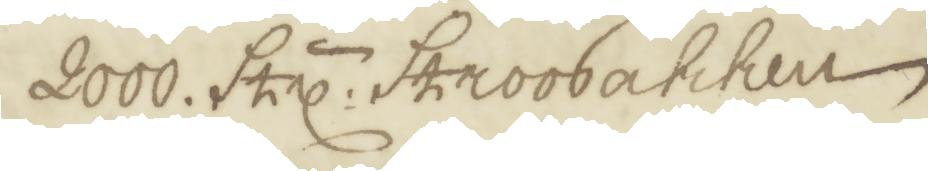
2000. Stx: Stroosakken
